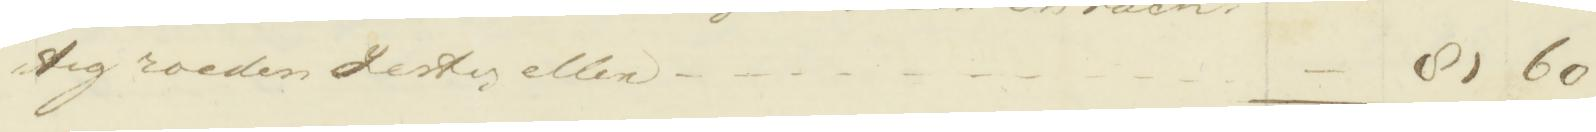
„tig roeden zestig ellen - - - - - - - - - - - — 81 60
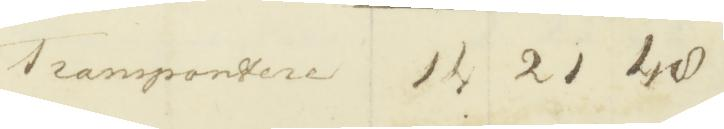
Transportere 14 21 48
